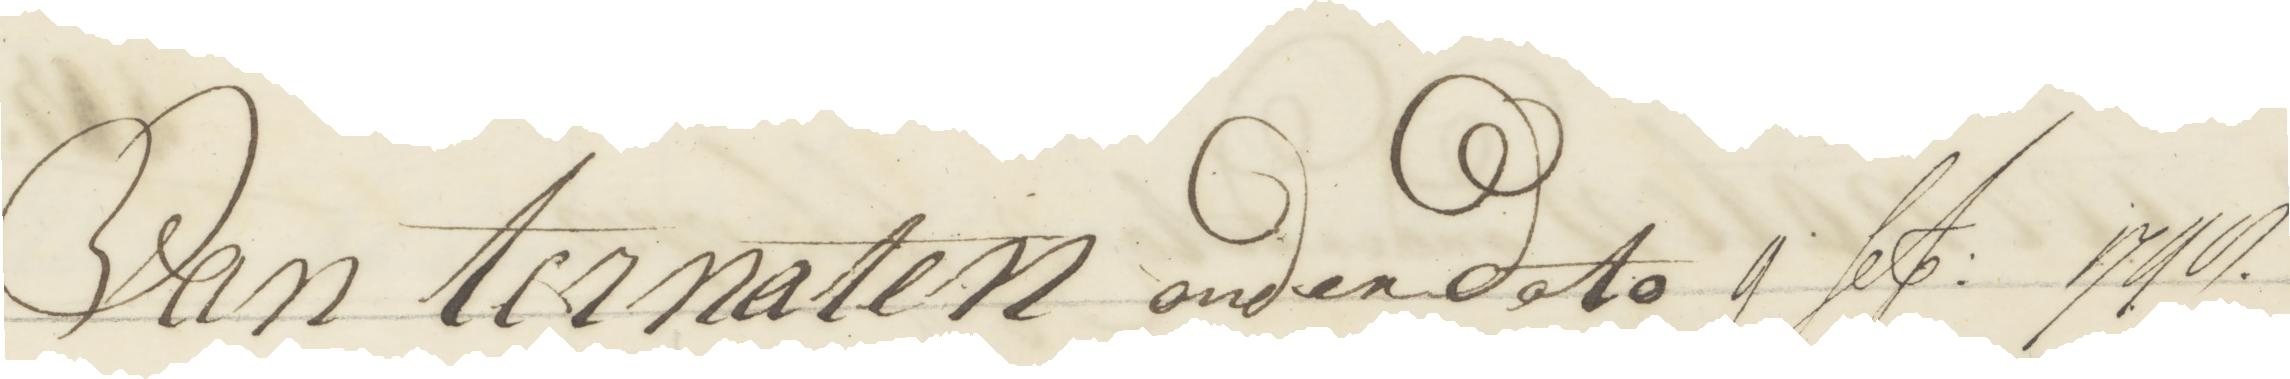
Van ternaten onder dato 9 sep: 1748.
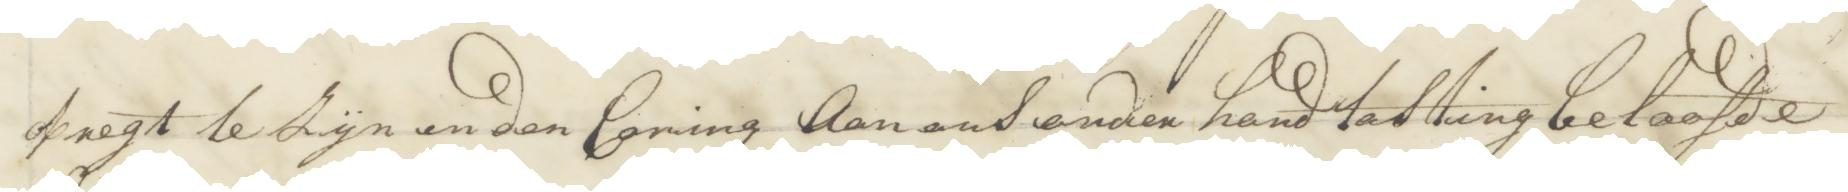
opregt te zijn en den Coning Aan ons onder handtasting beloofde
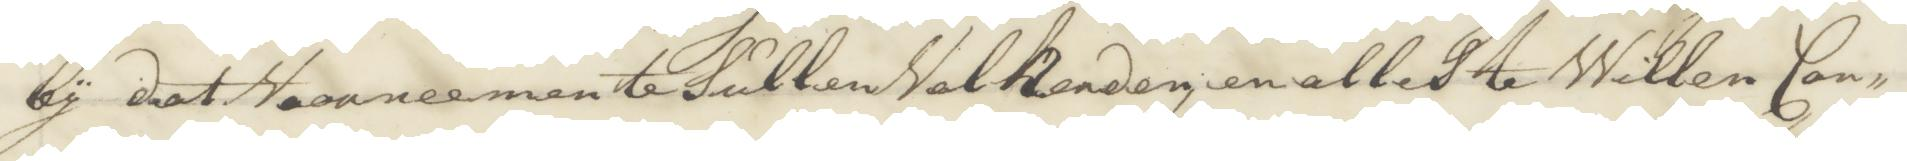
bij dat voorneemen te sullen volharden, en alles te willen Con„
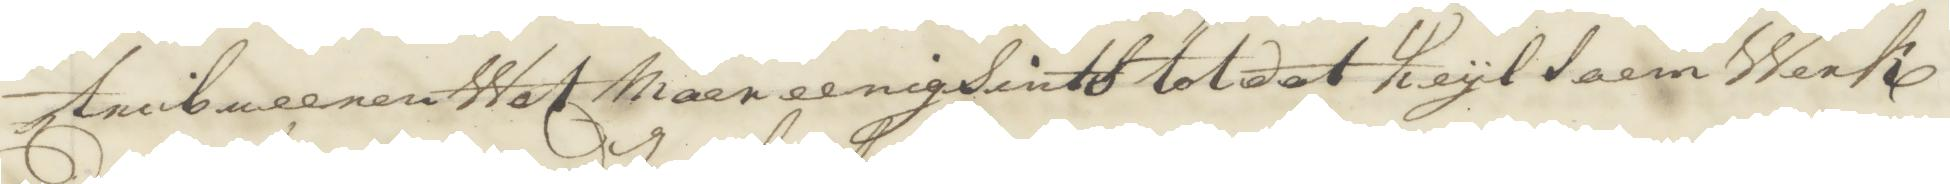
„tribueeren wat maer eenigsints tot dat heijl saem werk
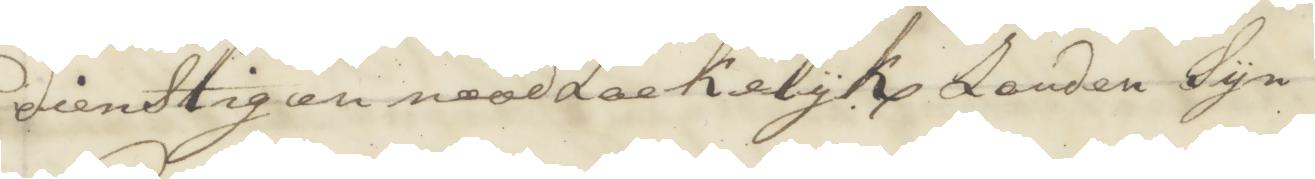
dienstig en noodzaekelijk zouden sijn
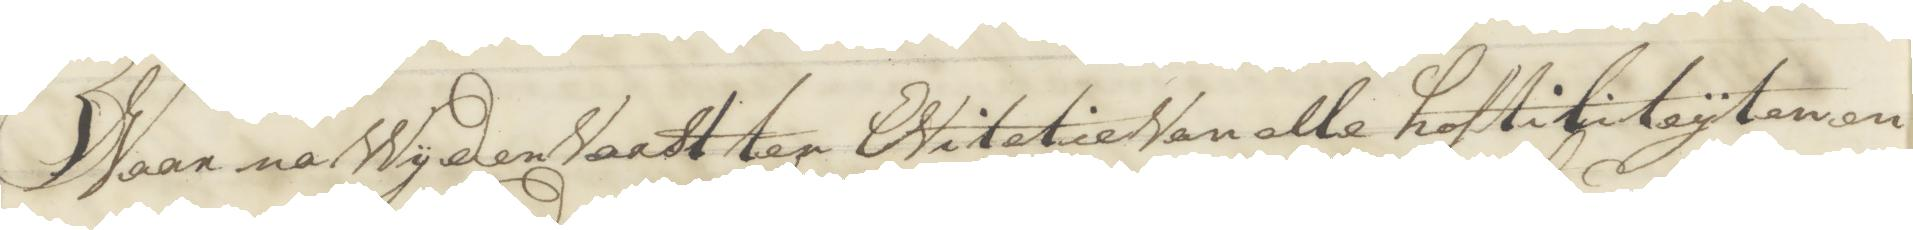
Waar na wij den vorst ter Evitatie van alle hostiliteijten en
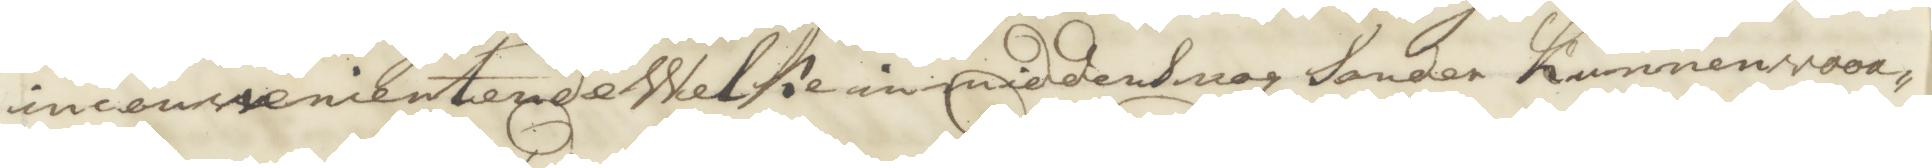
inconvenienten de welke in middens nog souden kunnen voor„
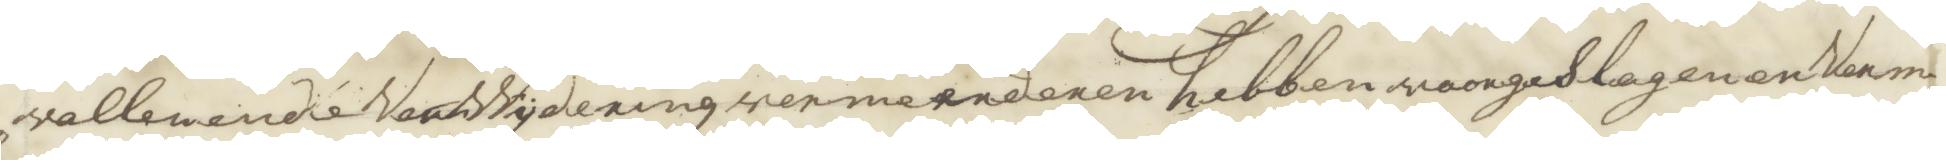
vallen ende verwijdering vermeerderen hebben voorgeslagen en verm
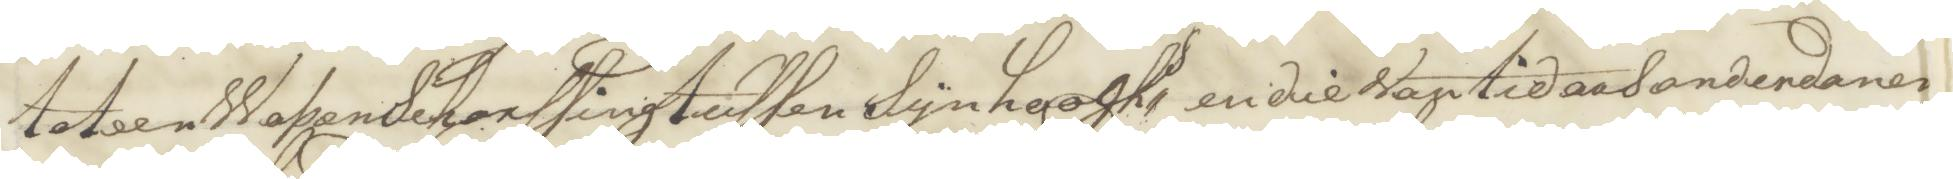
tot een wapenschorssing tussen sijn hoogh„s en die van tidaas onderdane
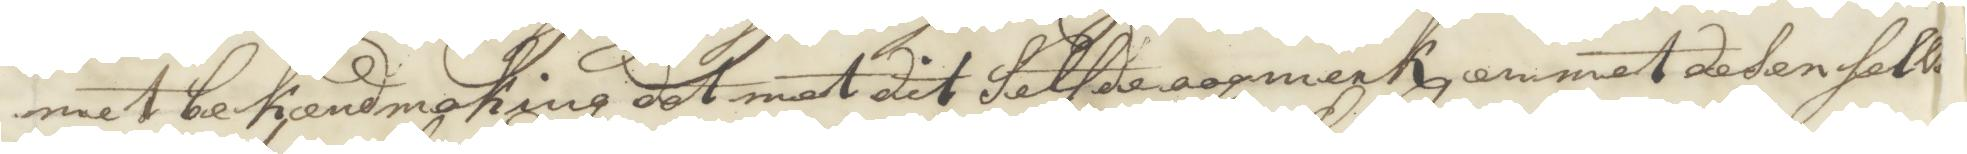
met bekendmaking dat met dit selfde oogmerk, om met desen selv
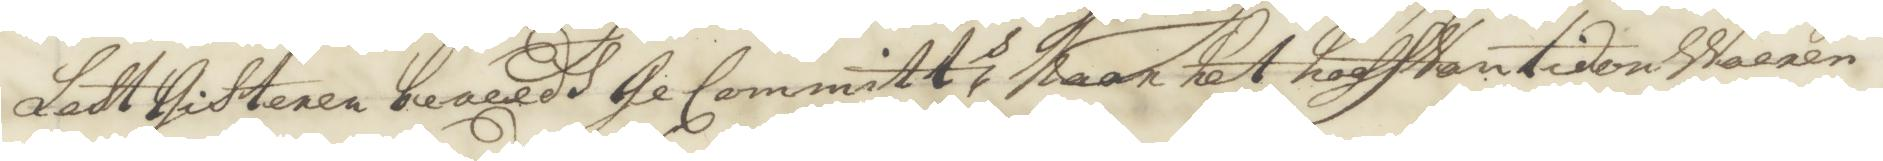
Last gisteren bereeds gecommitt„s naar het hoff van tidon waeren
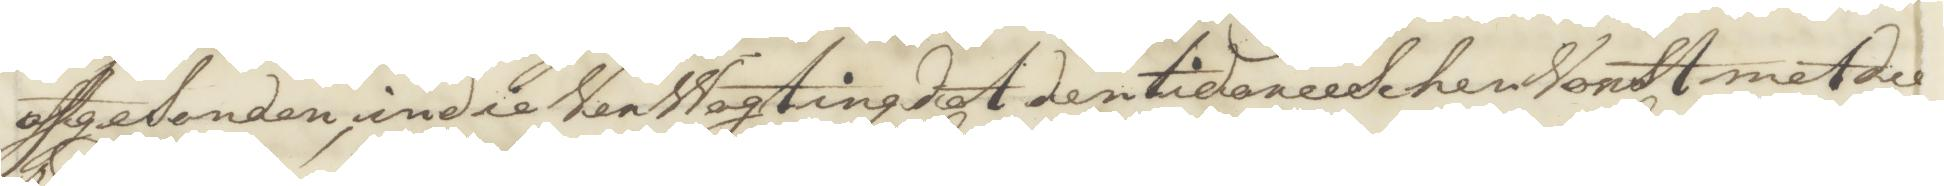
affgesonden, in die verwagting dat den tidoreeschen vorst met de
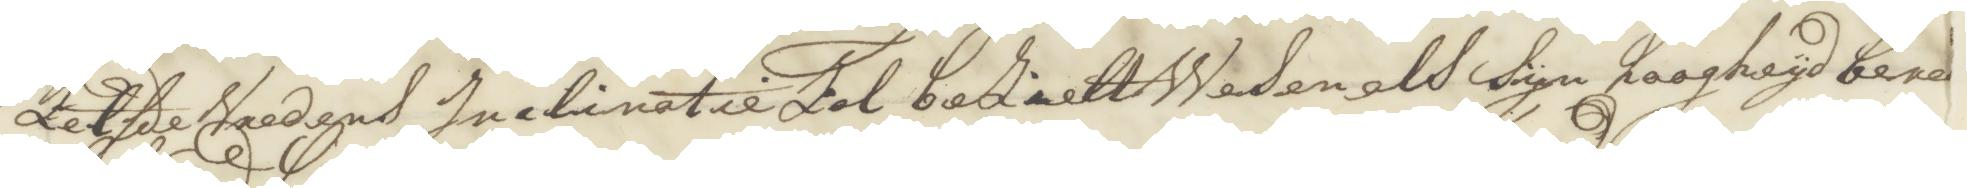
zelfde vredens Jnclinatie zal bezielt wesen als sijn hoogheijd bere
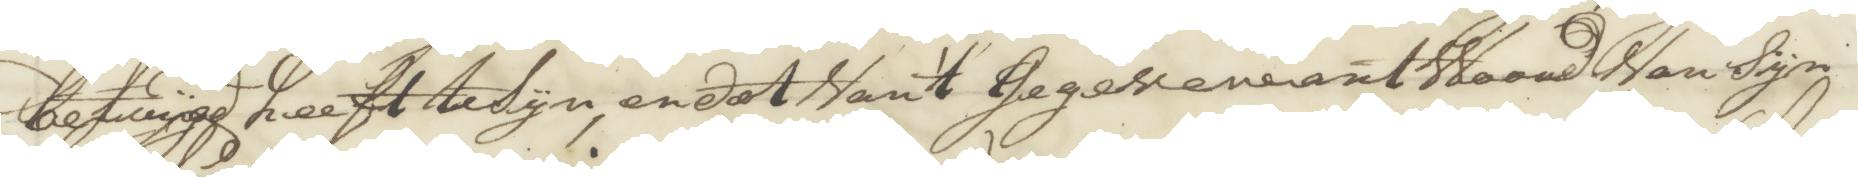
betuijgd heeft te sijn, en dat van't gegevene antwoord van sijn
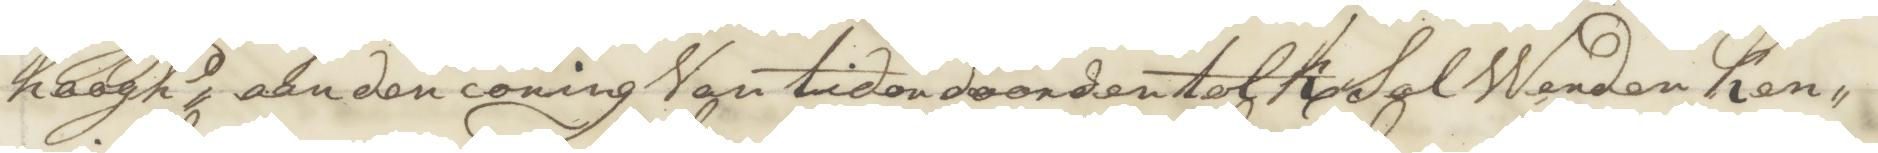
hoogh„d aan den coning van tidor door den tolk sal werden ken„
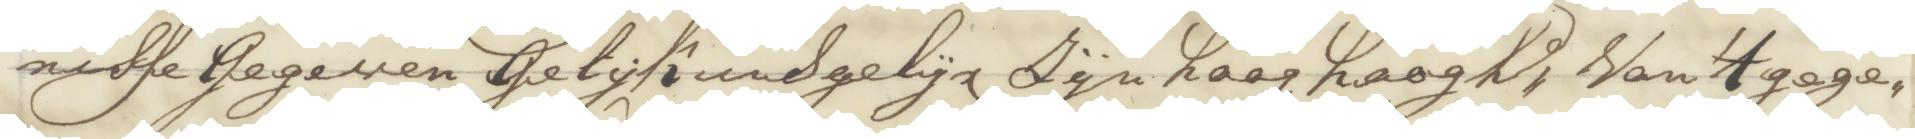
nisse gegeven gelijk insgelijx zijn hoog hoogh„d van ’t gege„
